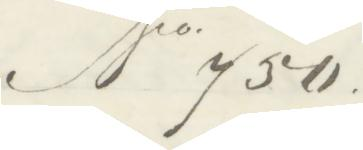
No 750.
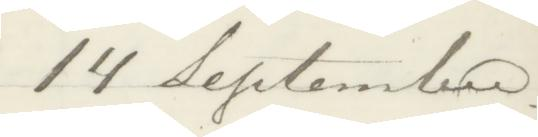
14 September
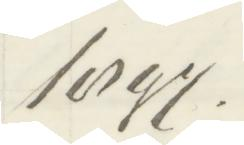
1897.
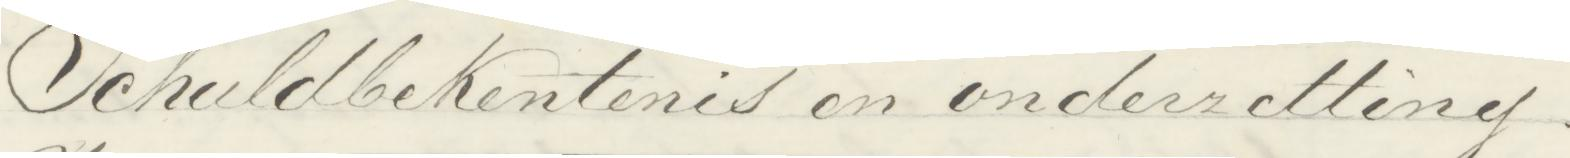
Schuldbekentenis en onderzetting
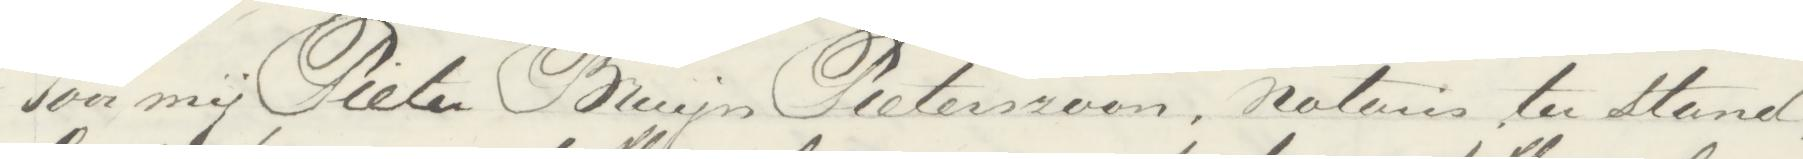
Voor mij Pieter Bruijn Pieterszoon, Notaris ter stand
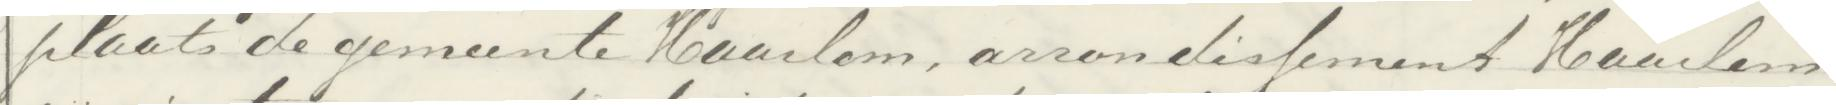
plaats de gemeente Haarlem, arrondissement Haarlem
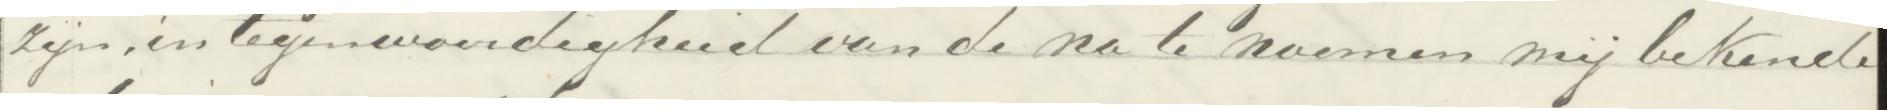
zijn, in tegenwoordigheid van de na te noemen mij bekende
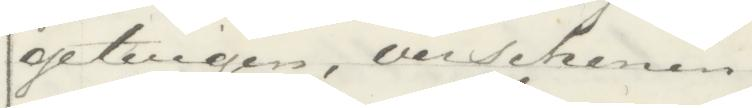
getuigen, verschenen
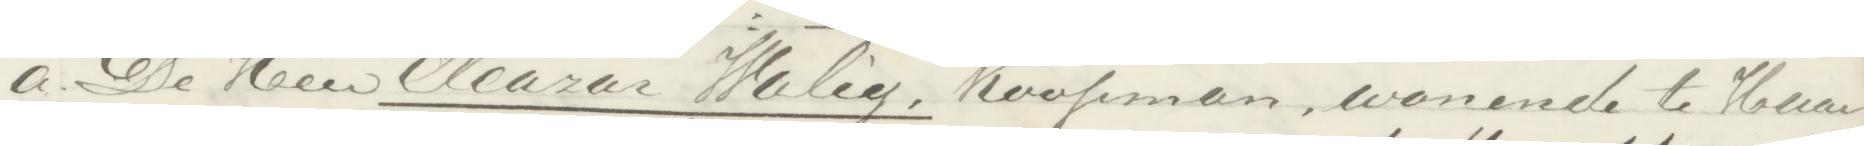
a. De Heer Eleazar Walig, Koopman, wonende te Haar
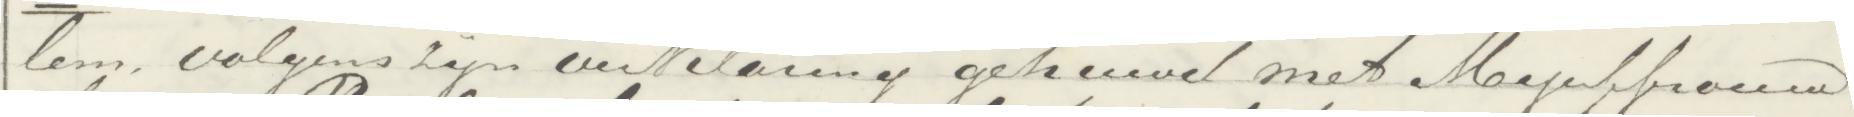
lem, volgens zijn verklaring gehuwd met Mejuffrouw
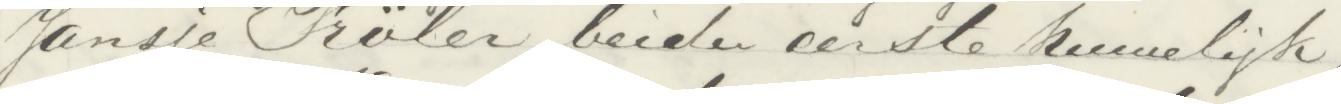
Jansje Pröler, beide eerste huwelijk
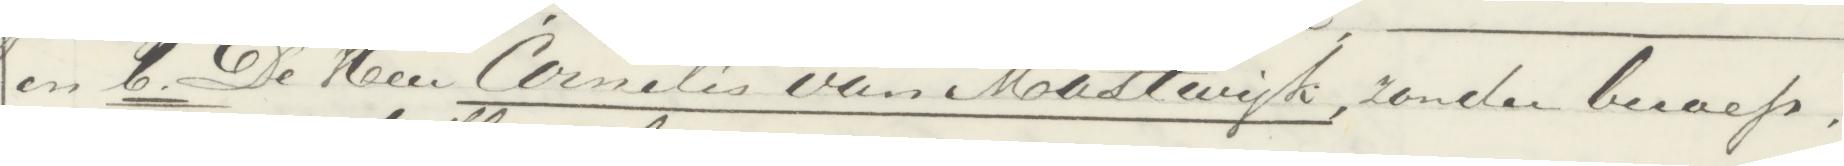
en b. De Heer Cornelis van Mastwijk, zonder beroep,
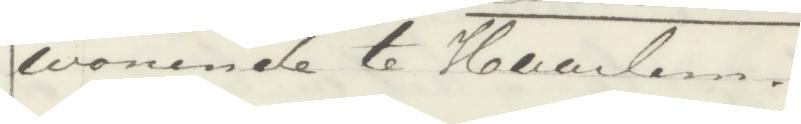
wonende te Haarlem.
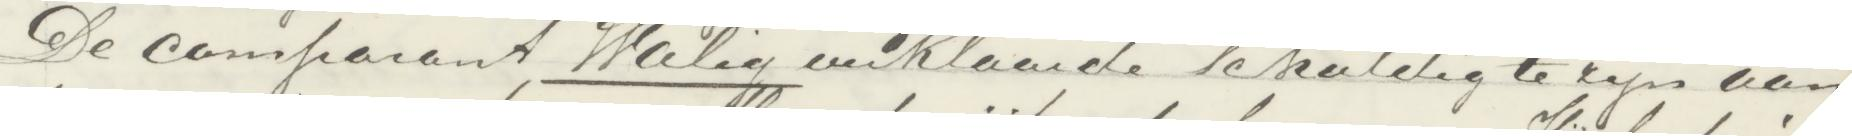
De comparant Walig verklaarde schuldig te zijn aan
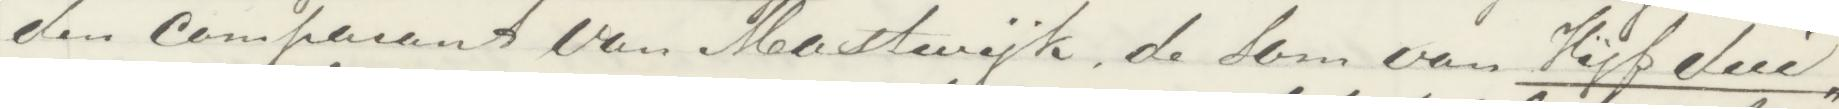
den comparant van Mastwijk, de som van Vijf dui
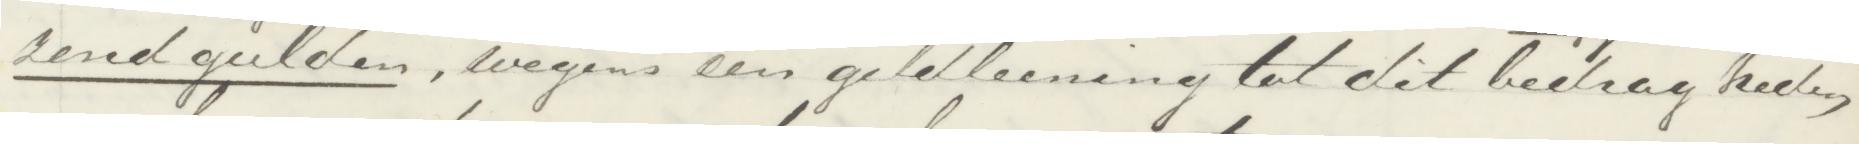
zend gulden, wegens een geldleening tot dit bedrag heden
